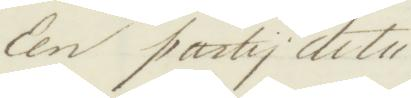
Een partij dito
